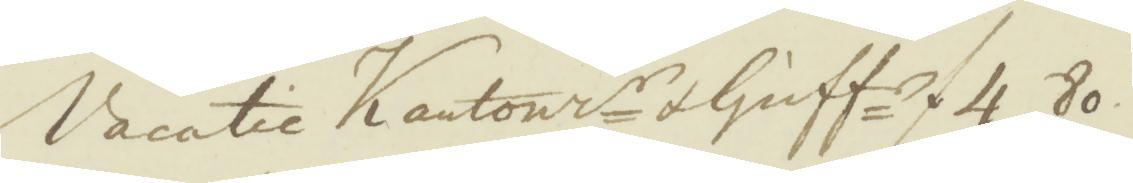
Vacatie Kantonr=r tGriff=s ƒ4 80.
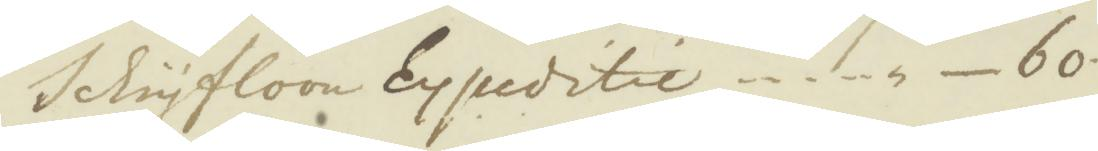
schrijfloon Expeditie - - - - - „ — 60.
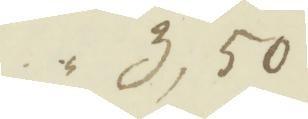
3,50
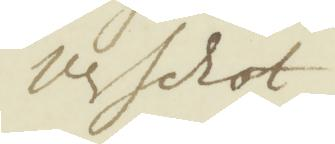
voorschot
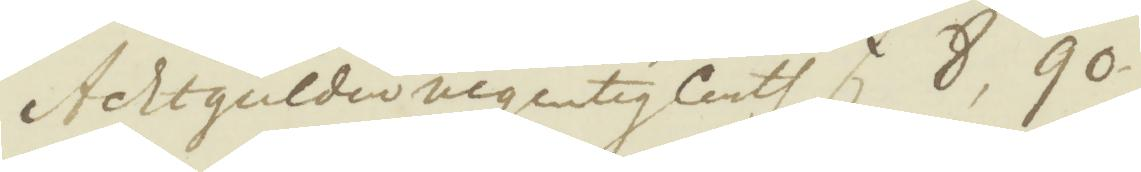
Acht gulden negentig Cents ƒ 8, 90.
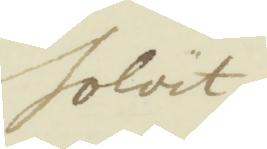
solvit,
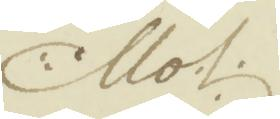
Mot:
